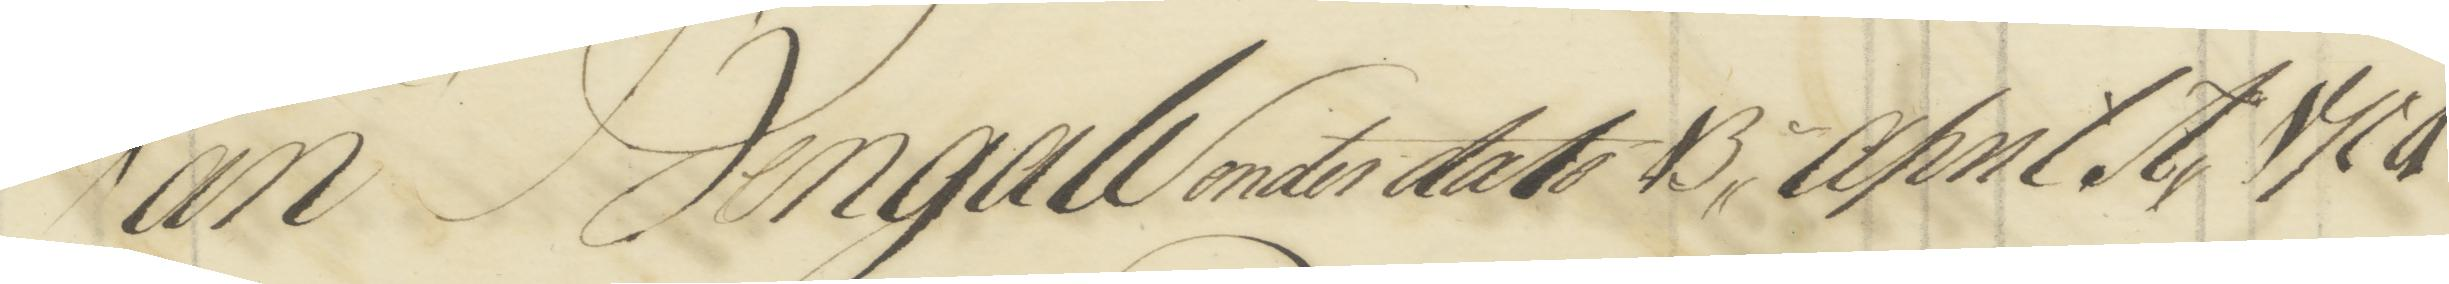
Van Bengale onder dato 13„' april A„o 1754
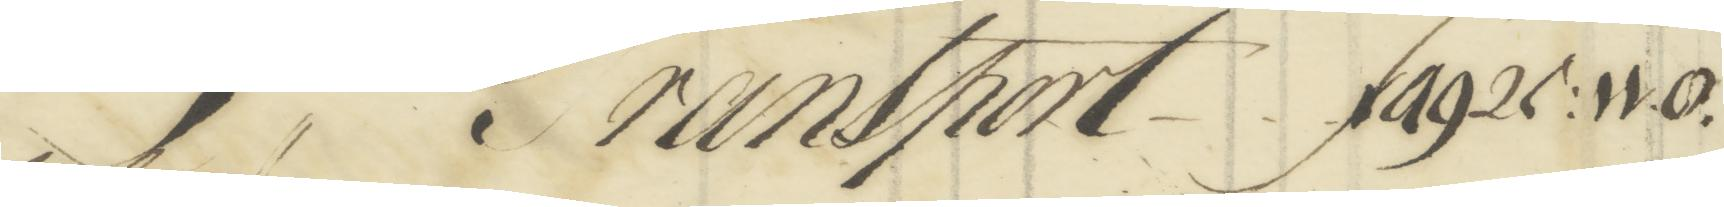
P„r Transport ƒ4925:11:8.
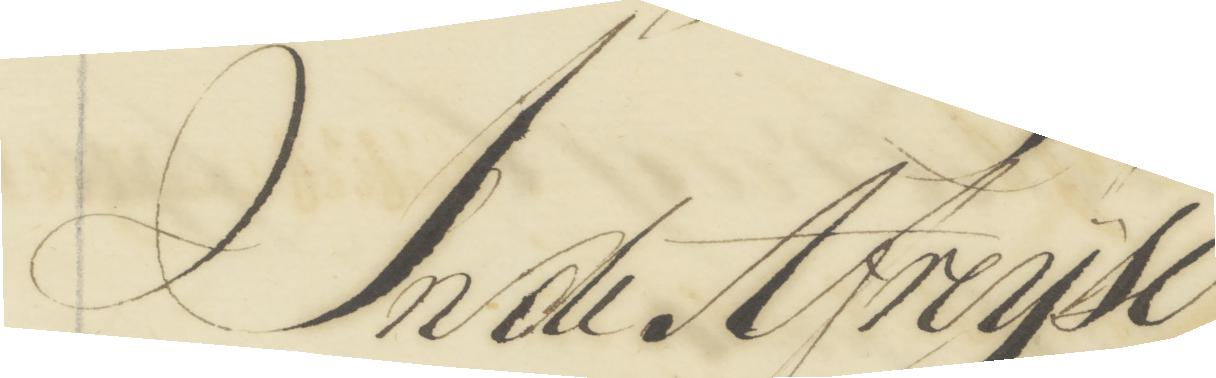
In de Afreijse.
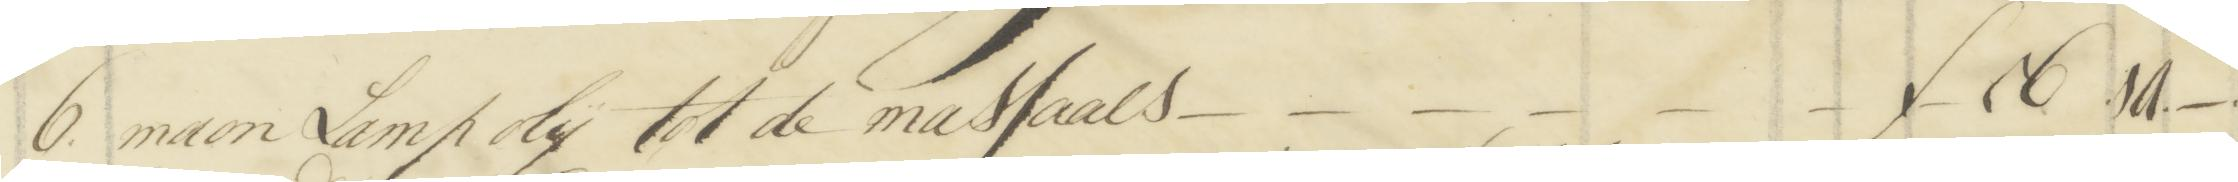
6. maon Lamp olij tot de massaals - - - - - - ƒ56.14.—.
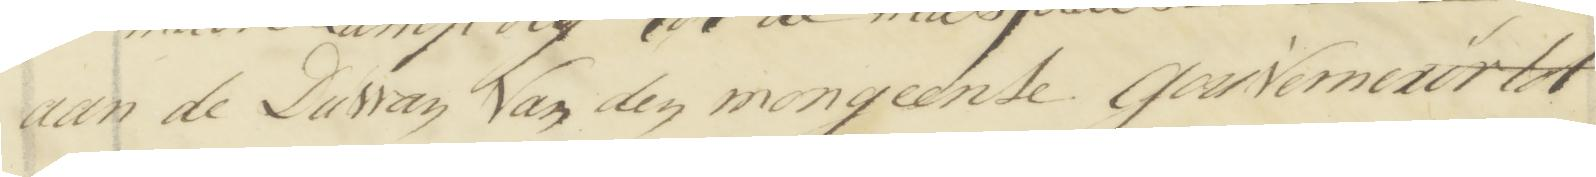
aan de Duvan van den mongeense Gouverneur tot
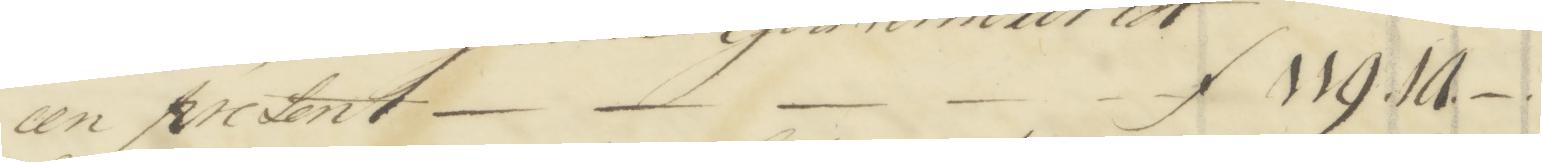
een present- - - - - - ƒ119.14.—.
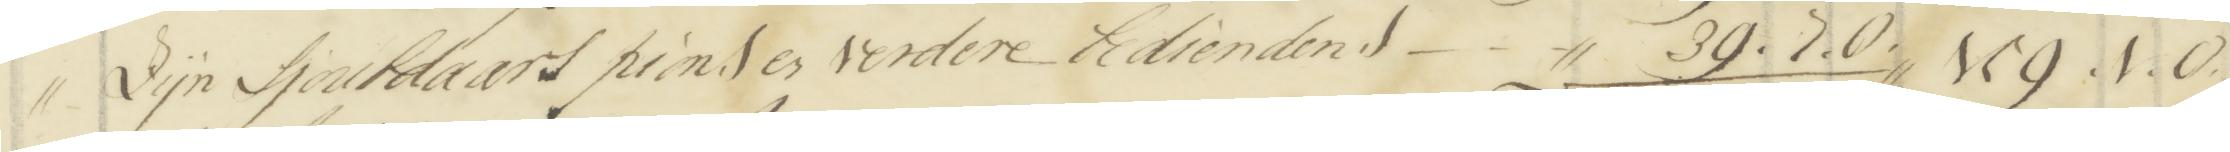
„ zijn Sjoubdaars prinsen verdere bediendens - - - „ 39. 7.0.„ 159.1.0.
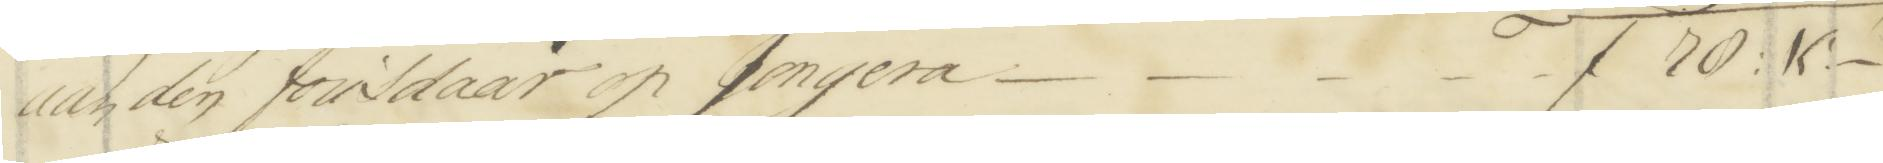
aan den fousdaar op Jongera - - - - - ƒ 78:15.—.
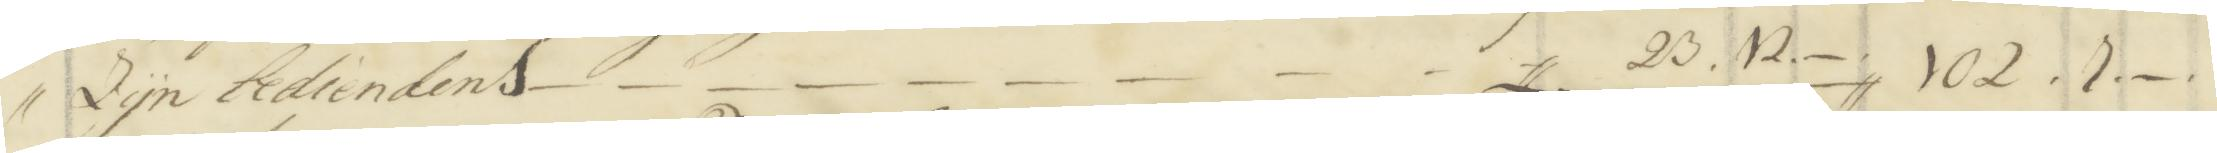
„ Zijn bediendens - - - - - - - - - „ 23.12.—. „ 102.7.—.
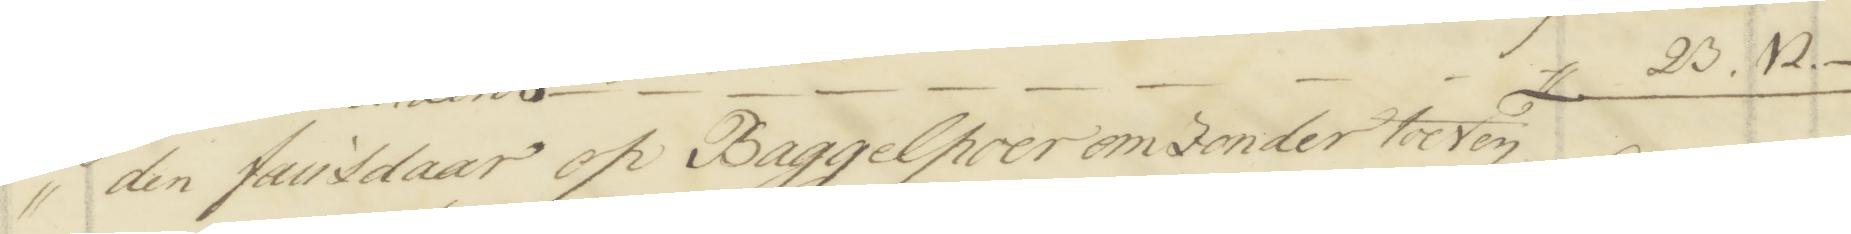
„ den fausdaar op Baggelpoer om zonder toeven
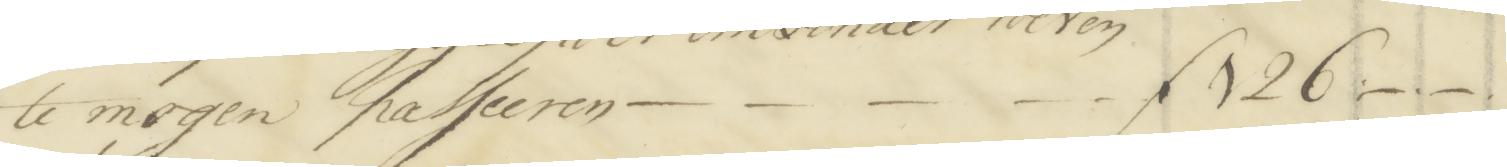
te mogen passeeren - - - - - ƒ126.—.—.
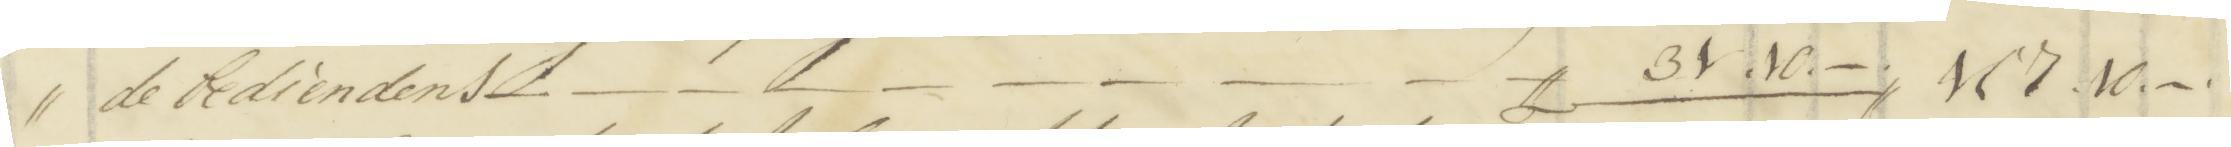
„ de bediendens - - - - - - - - - „ 31.10.—. 157.10.—.
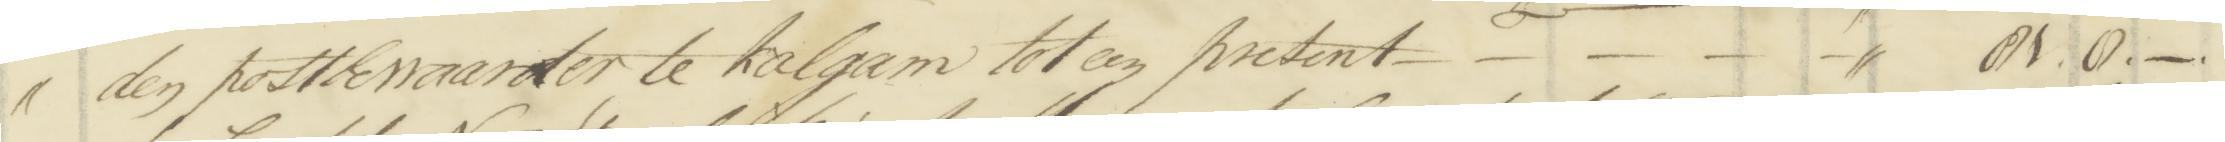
„ den postbewaarder te kalgam tot een present - - - - „ 81.8.—.
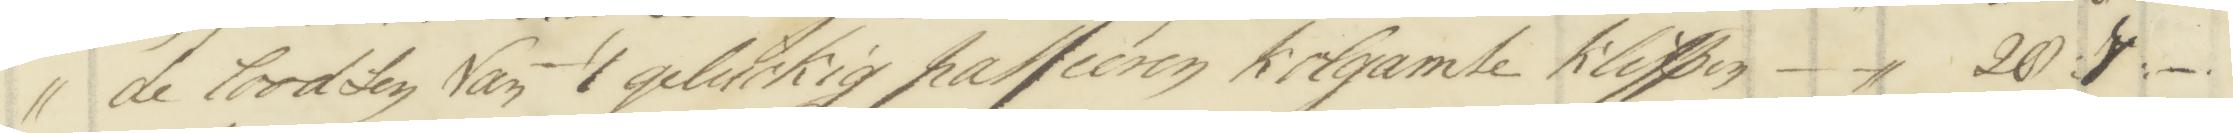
„ de loodsen Van ’t geluckig passeeren kolgamse klippen - - „ 28:7:—.
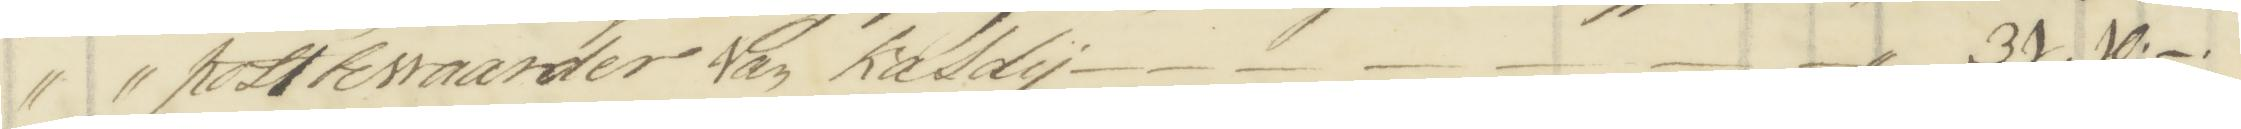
„ „ postbewaarder Van kasdij - - - - -„ 31.10:—.
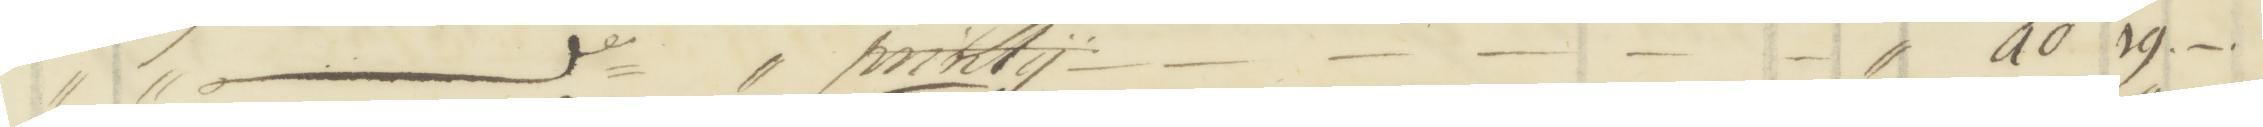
„ „ —' „ priktij - - - - - - „ 40 19.—.
